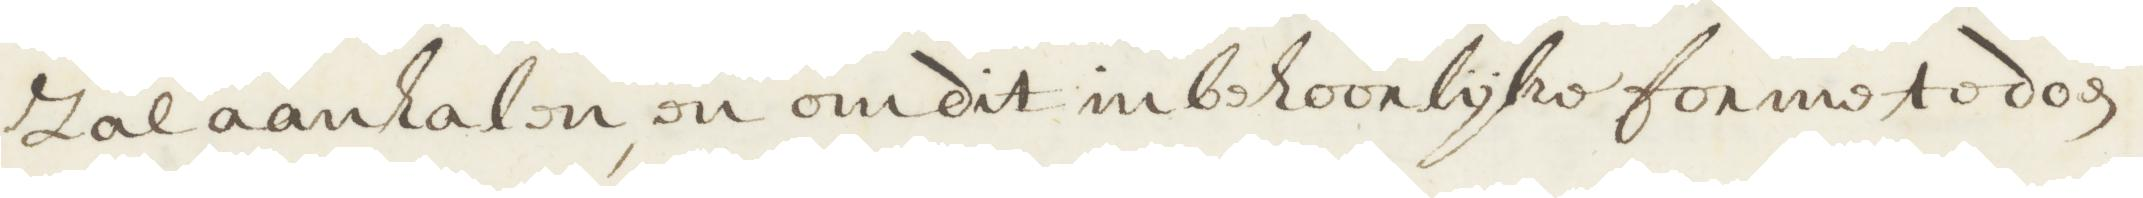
zal aanhalen, en om dit in behoorlijke forme te doen
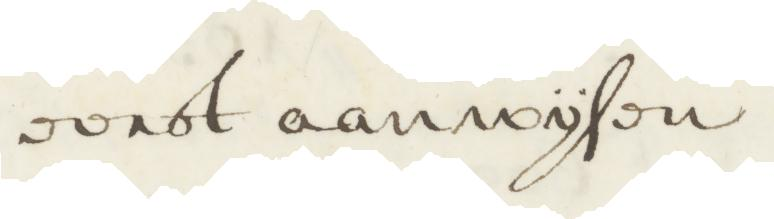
eerst aanwijsen
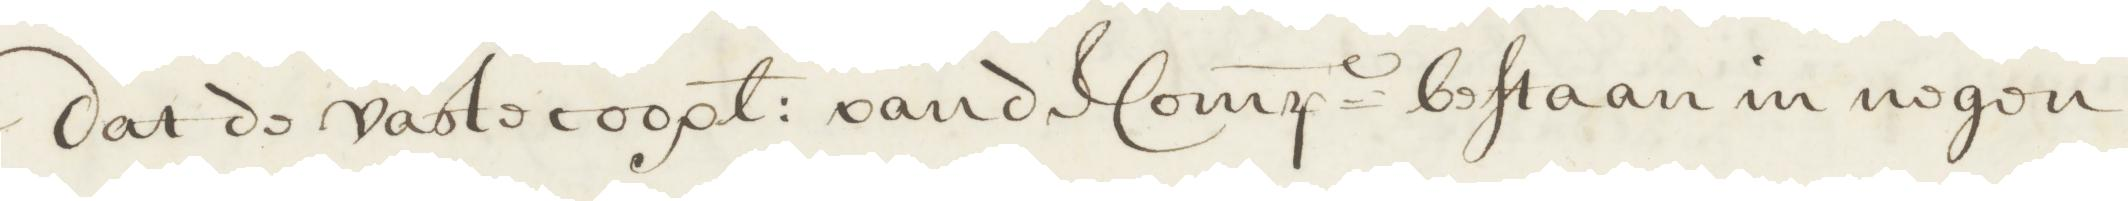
dat de vaste coopl: van d EComp=e bestaan in negen
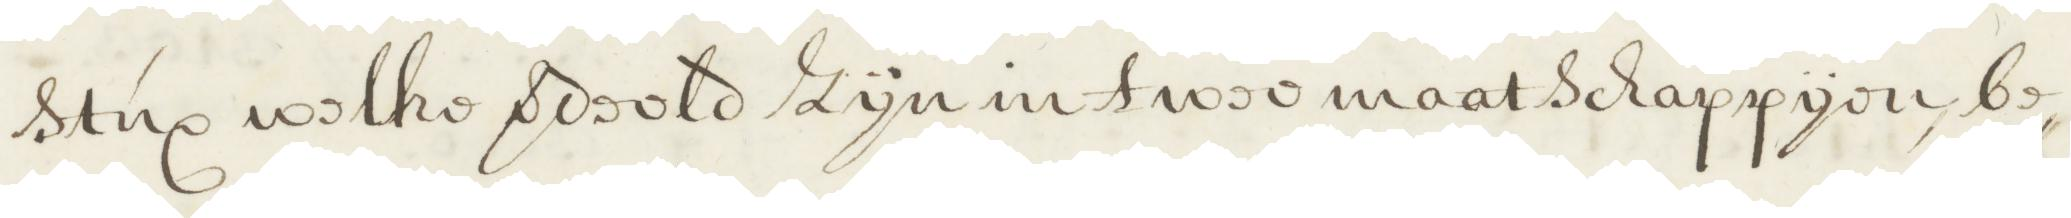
stux welke verdeeld zijn in twee maatschappijen, be„
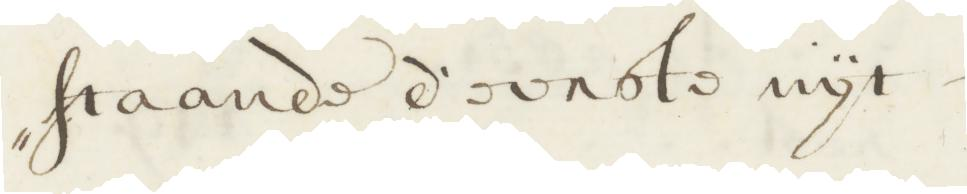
staande d’eerste uijt
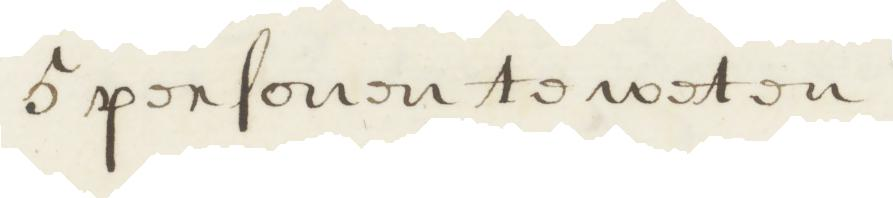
5 personen te weten
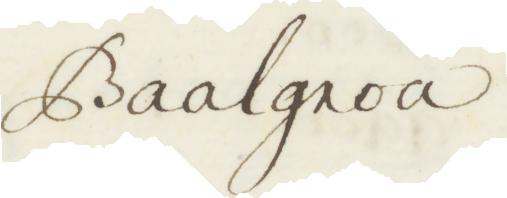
Baalgroa
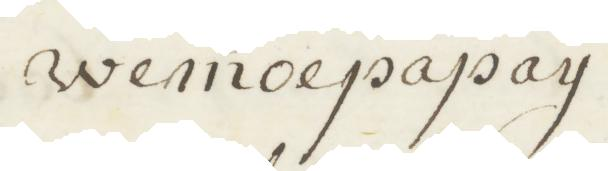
wemoepapaij
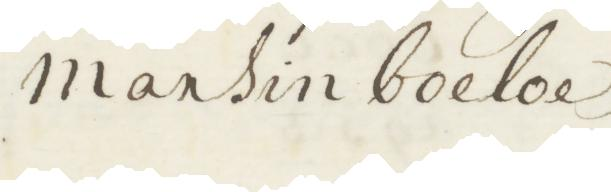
Marsin boeloe
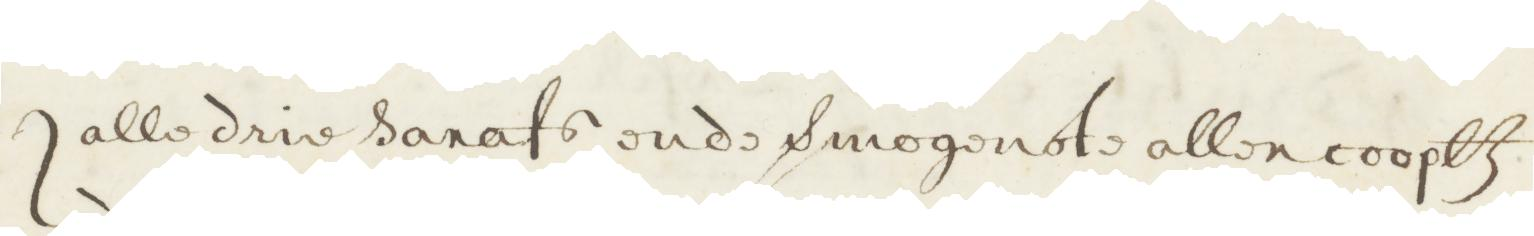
alle drie sarafs ende vermogenste aller coopl
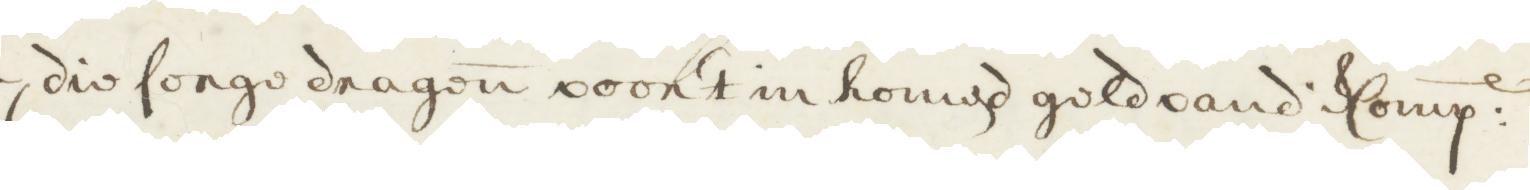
die sorge dragen voor’t in komend geld van d' EComp:e
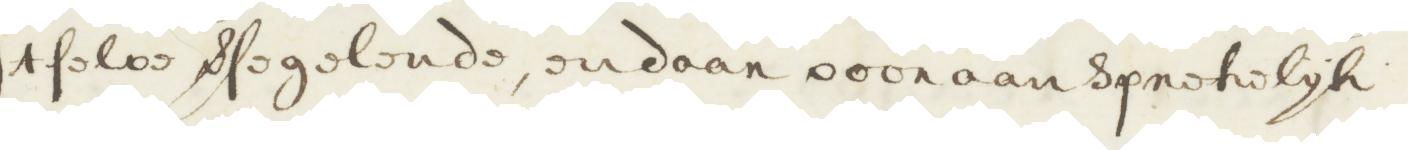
t selve versegelende, en daar voor aansprekelijk
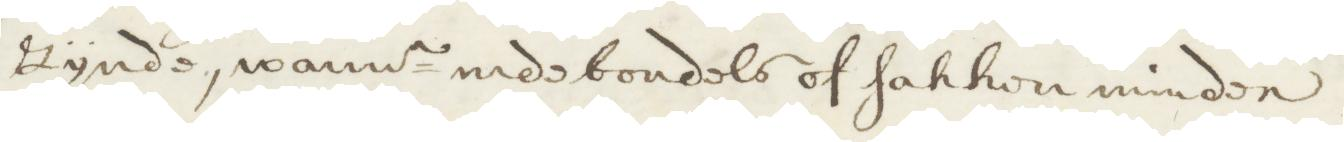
zijnde, wann=r inde bondels of sakken minder
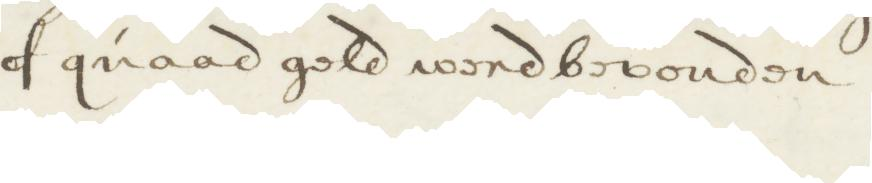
of quaad geld werd bevonden
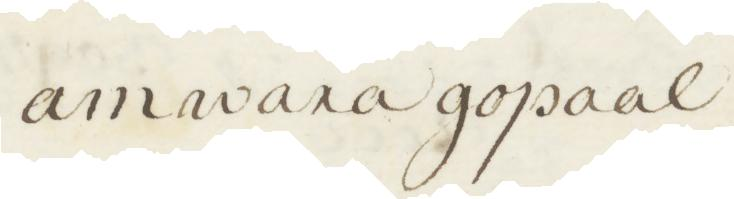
amwara gopaal
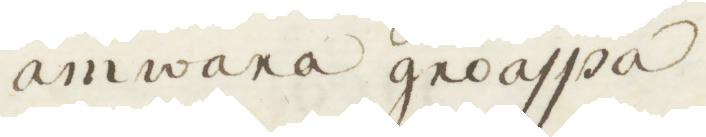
amwara groappa
